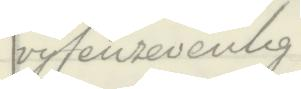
vyf enzeventig
